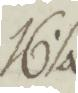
16¼
